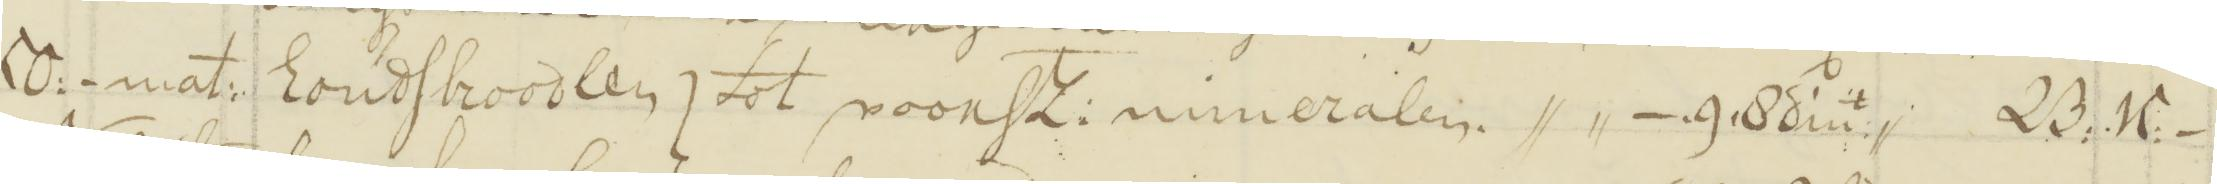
50: - mat: houdskoodlen tot voorsz: mineralen. „ „ —.9.8 din„t 23:.15:-
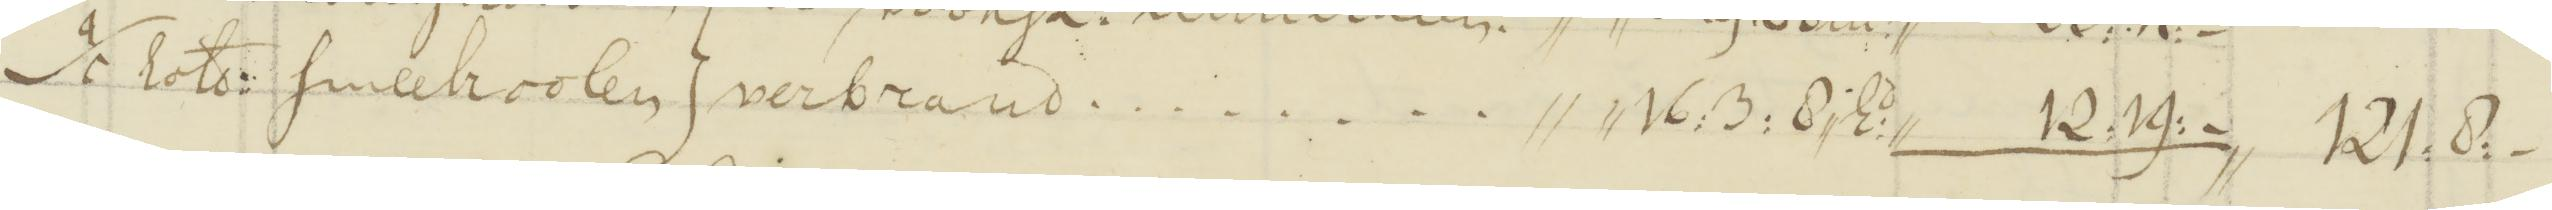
4/5 hold: smeekoolen verbrand . . . - . - - . 16:3: 8„ h:d„ 12.19:-„ 121:8.-
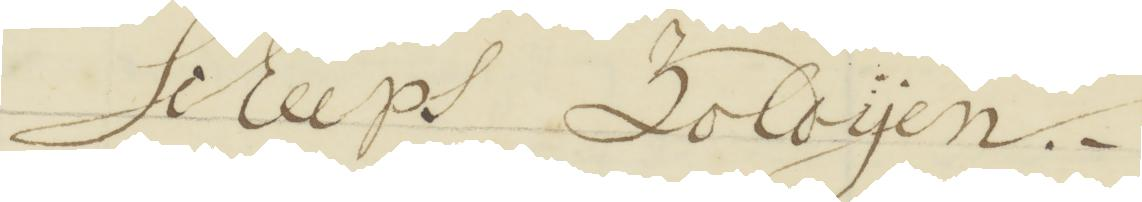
scheeps Zoldijen.-
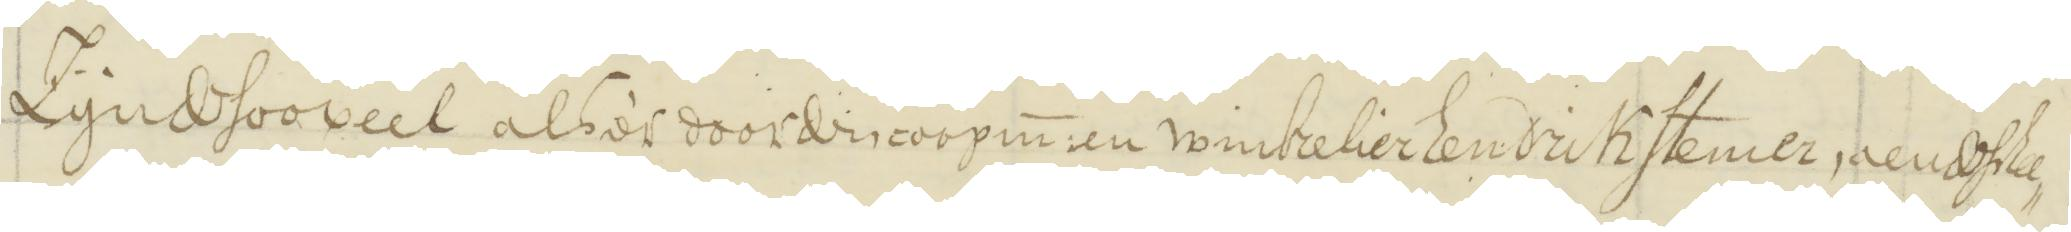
zijnde sooveel als er door den coopm: en winkelier hendrik stemer, aen deschee„
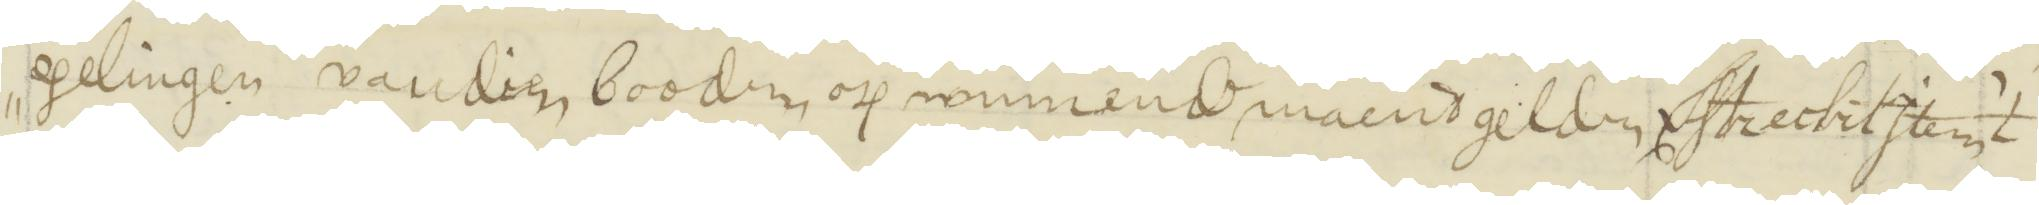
„pelingen vandien boodem op winnende maend gelden verstreckt jtem 't
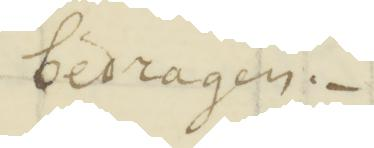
bedragen.-
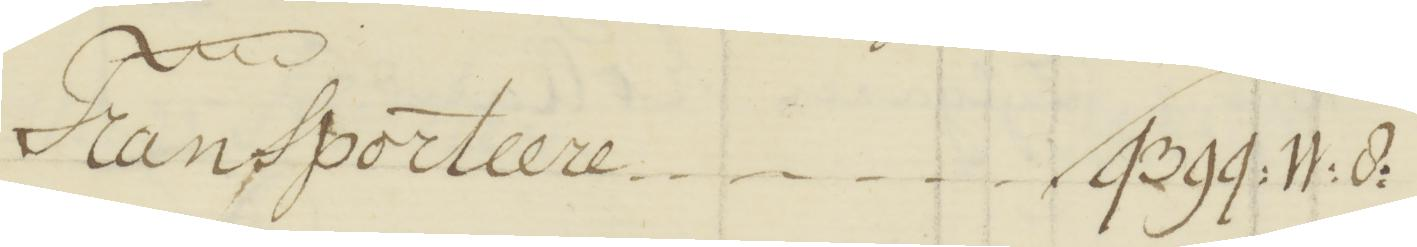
Transporteere- - - - - - - ƒ 4394:11:8:
